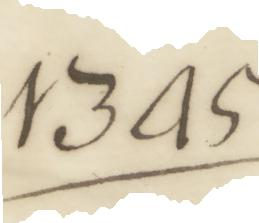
1345
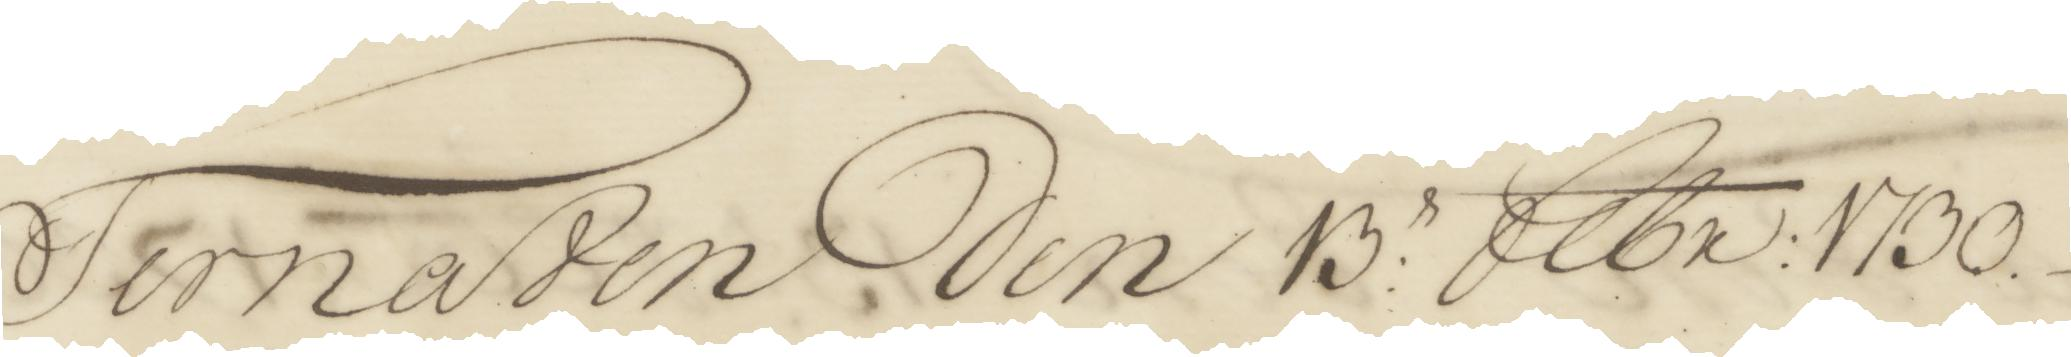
Ternaten den 13: en febr: 1730.
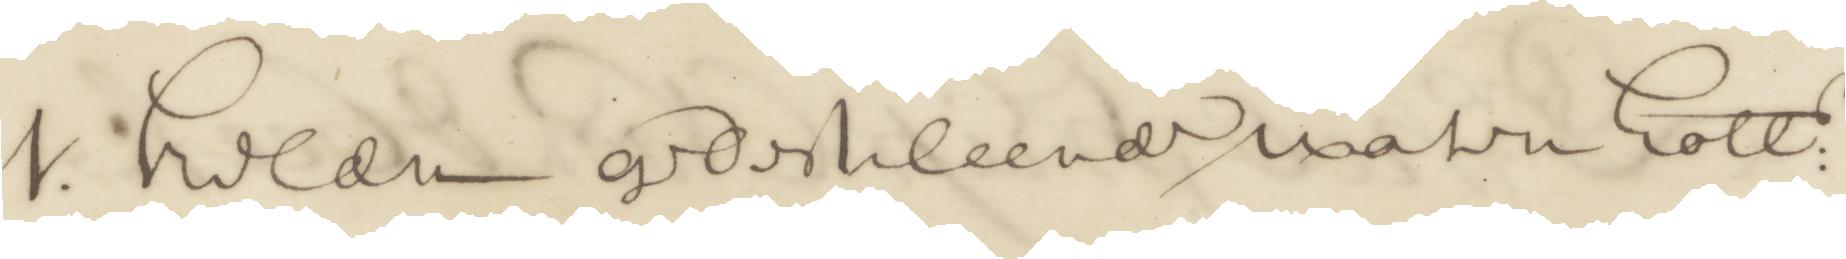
1. kelder gedestileerde water holl:s
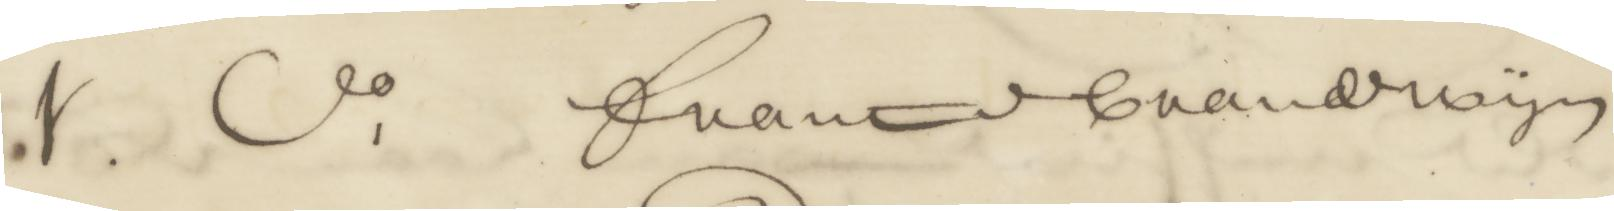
1. d.o france brandewijn
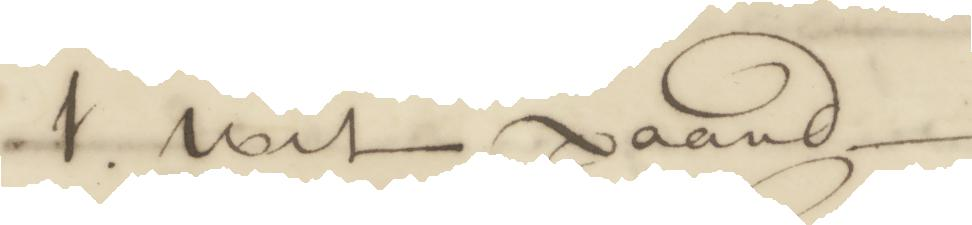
1. wit paard
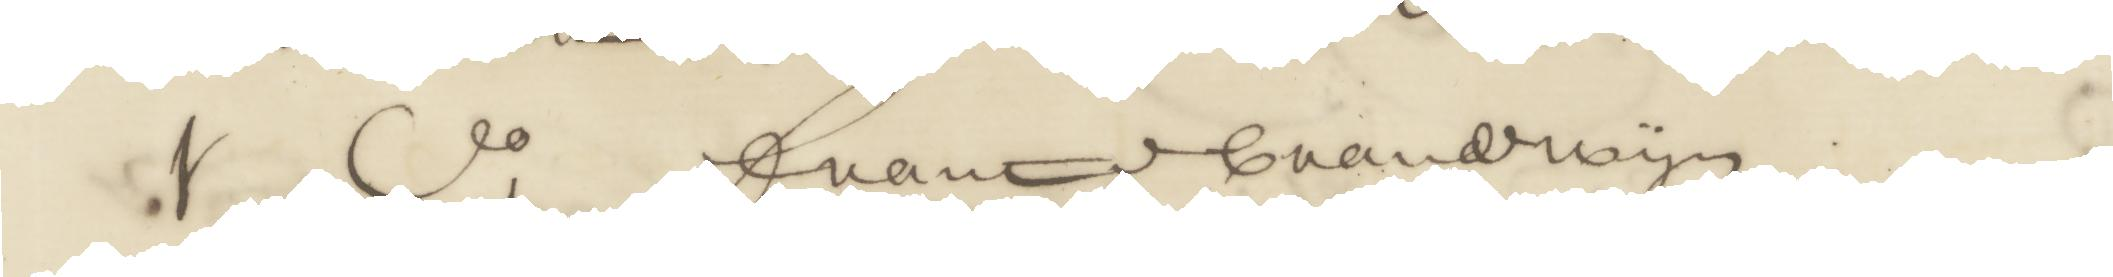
gest: In t Casteel Tot Batavia
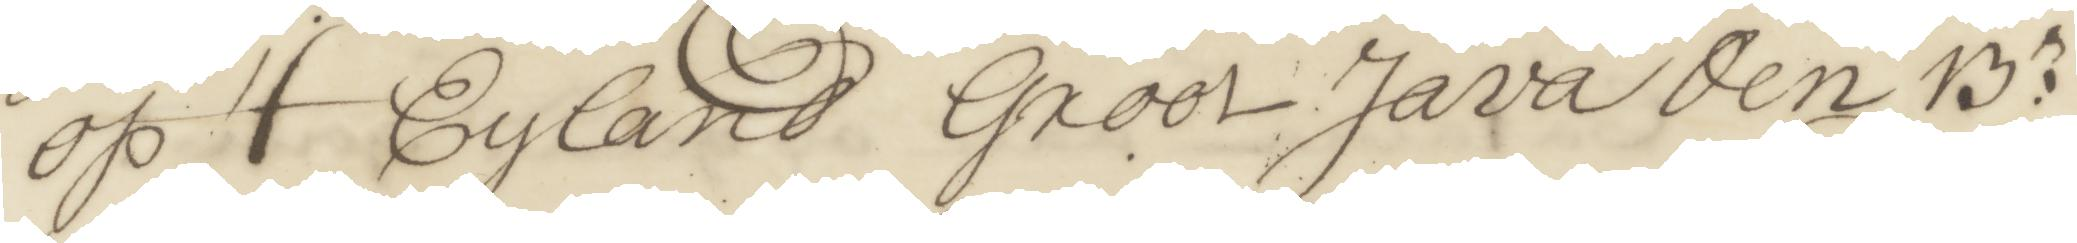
op ’t Eyland Groot Java den 13:en
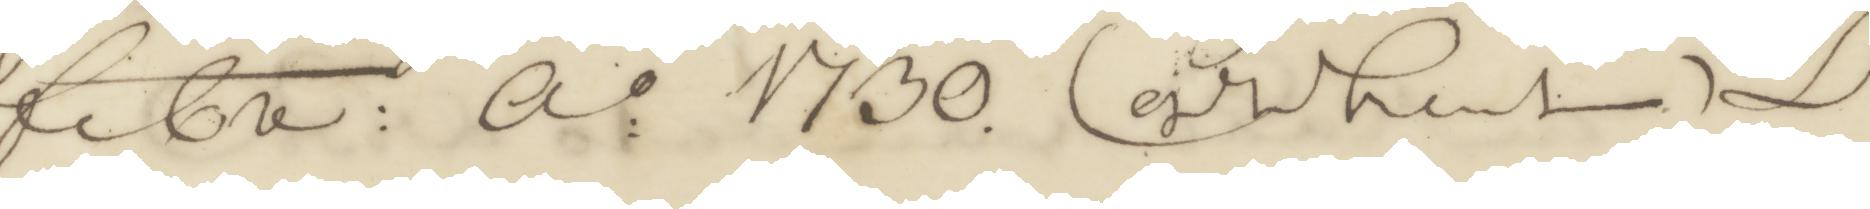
febr: a:o 1730. (getekent) D:k
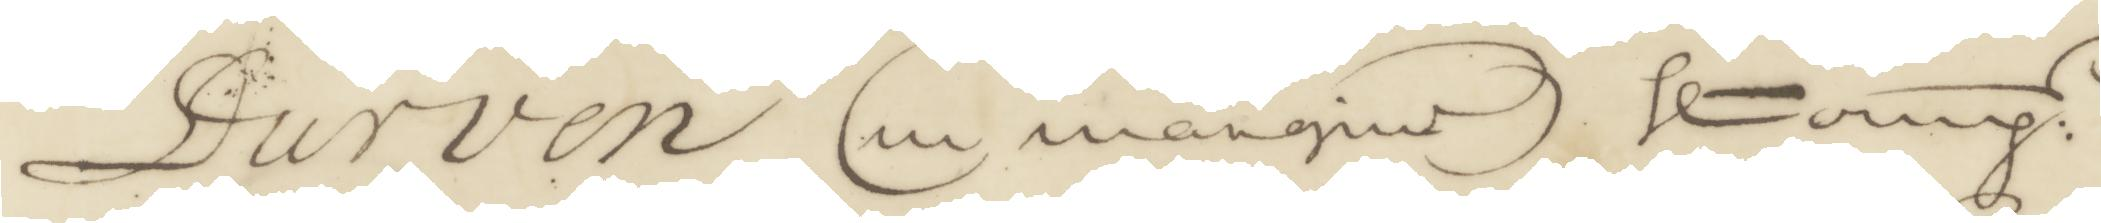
Durven (in margine) sComp:s
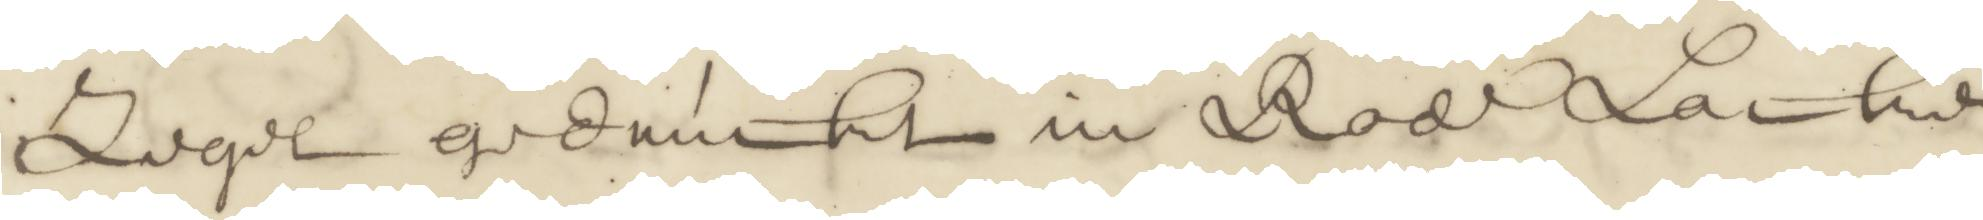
Zegel gedruckt in Rode Lacke
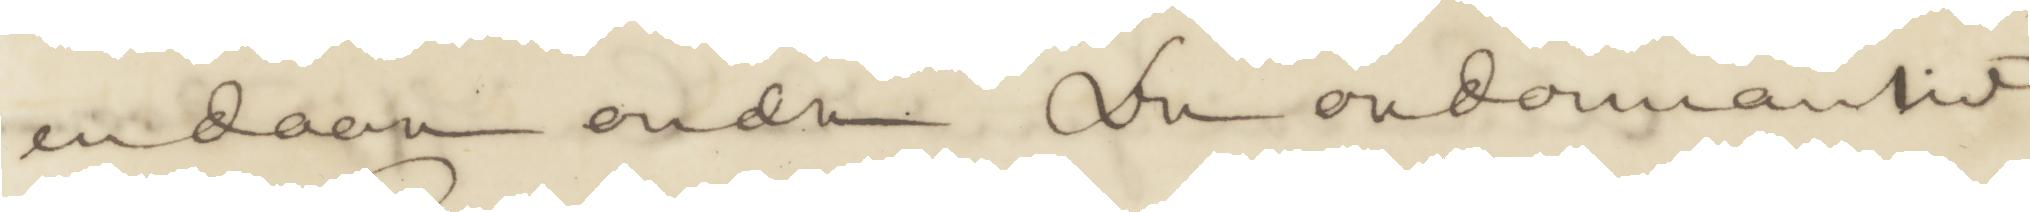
en daar onder ter ordonnantie
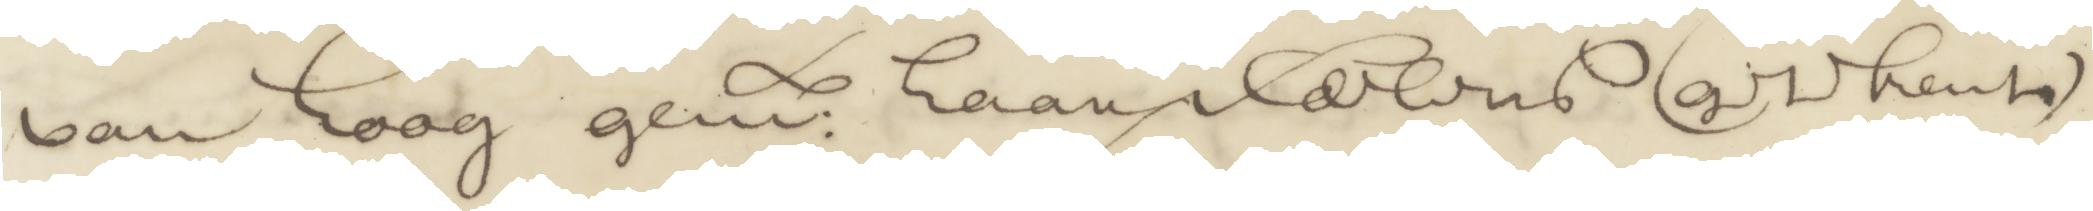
van hoog gem:te haar Edelens (getekent)
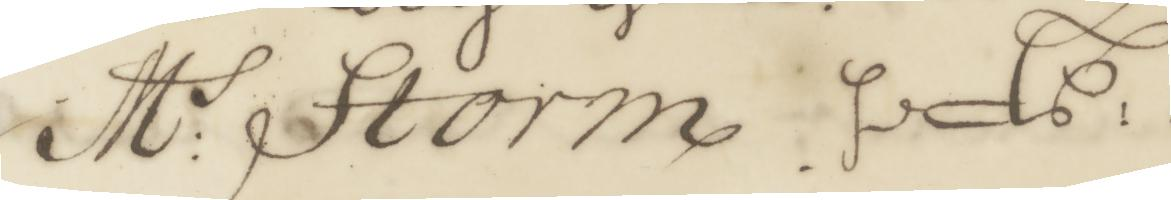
M:s Storm. sects:
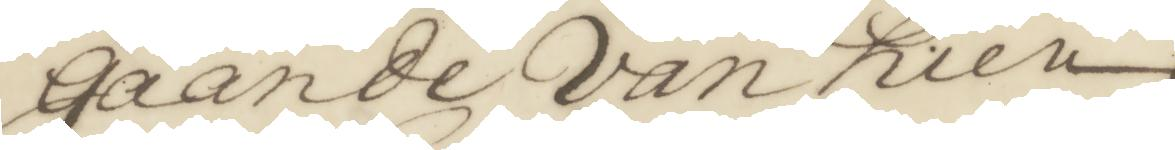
gaande van hier
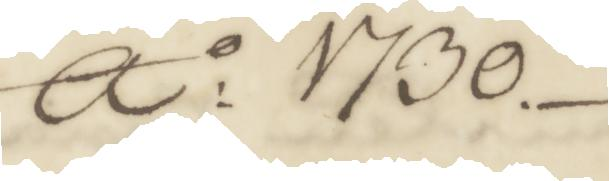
a:o 1730.-
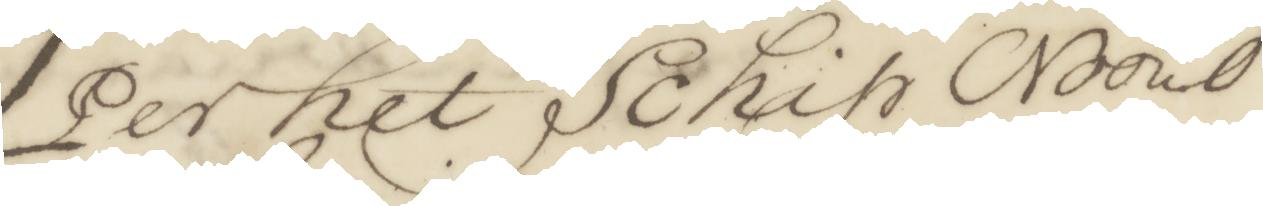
Per het schip Noord
